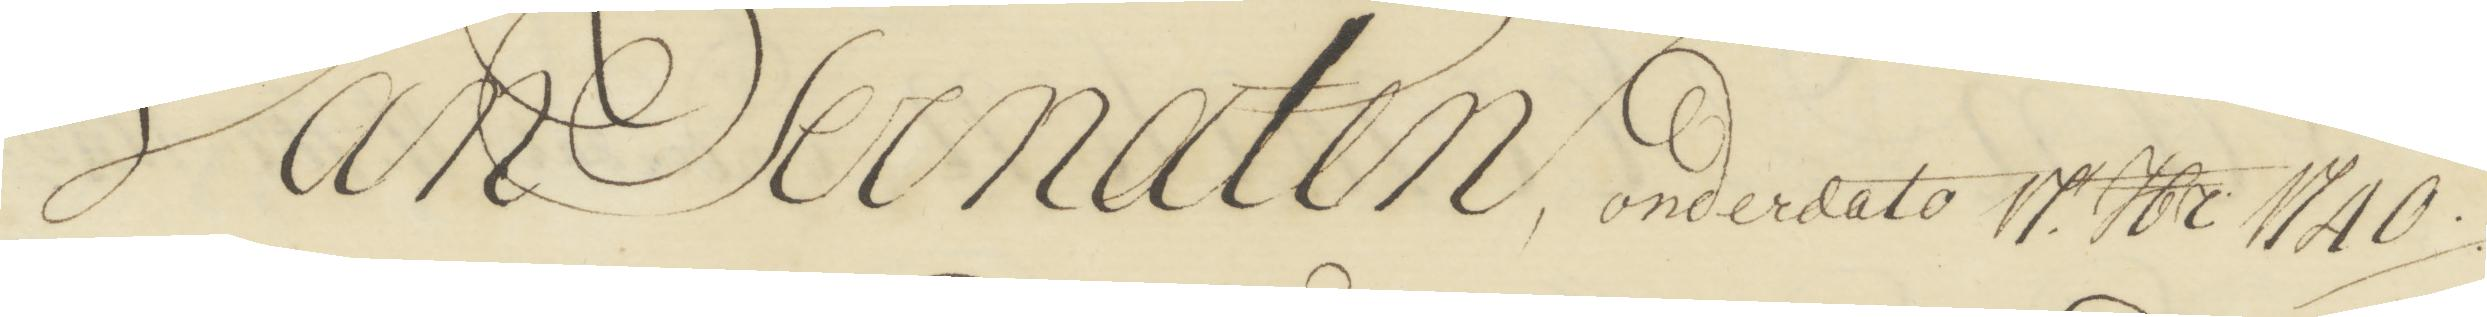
Van Ternaten, onder dato 17.' 7br 1740
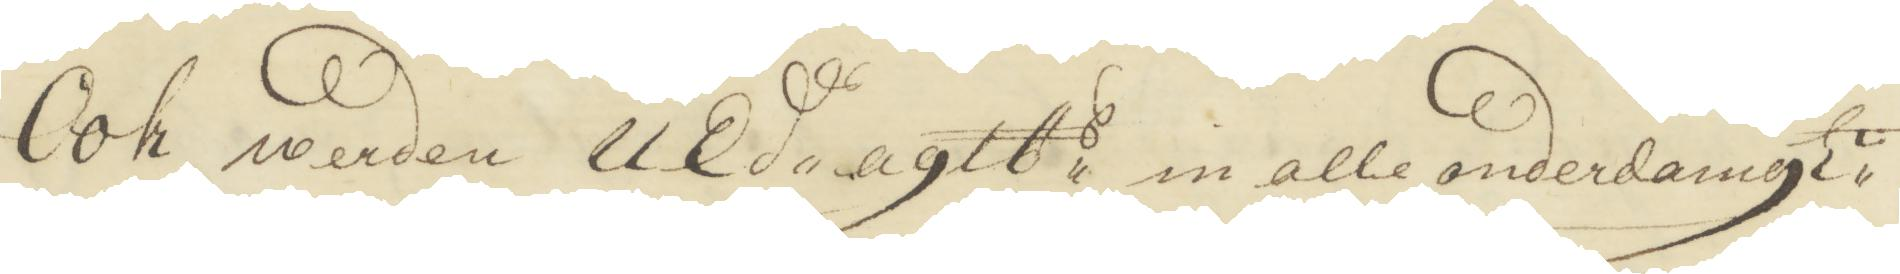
Ook werden UEd„s agtb„s in alle onderdanigh„t
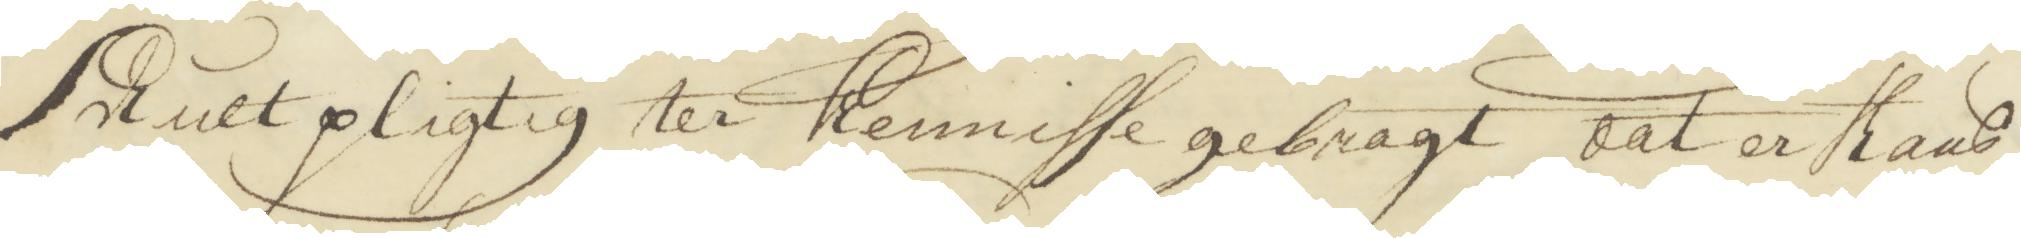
schultpligtig ter kennisse gebragt dat er thans
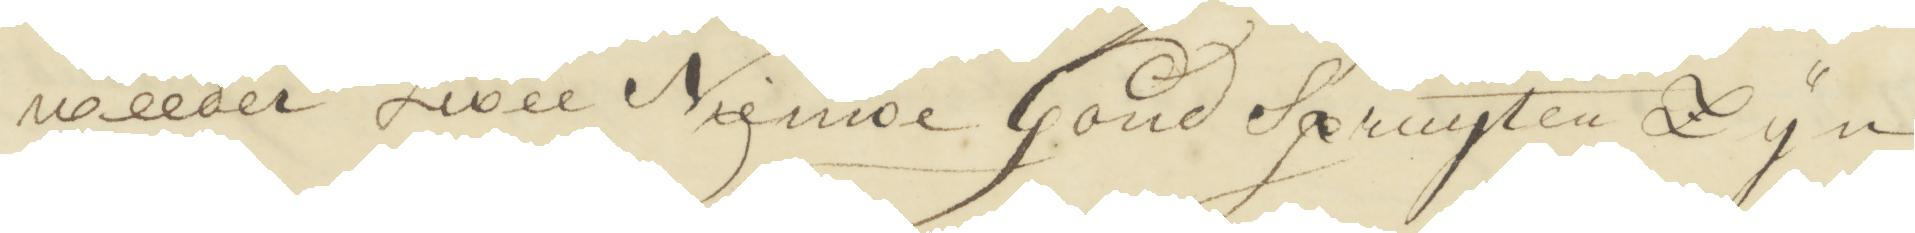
weeder twee Nieuwe Goud spruijten zijn
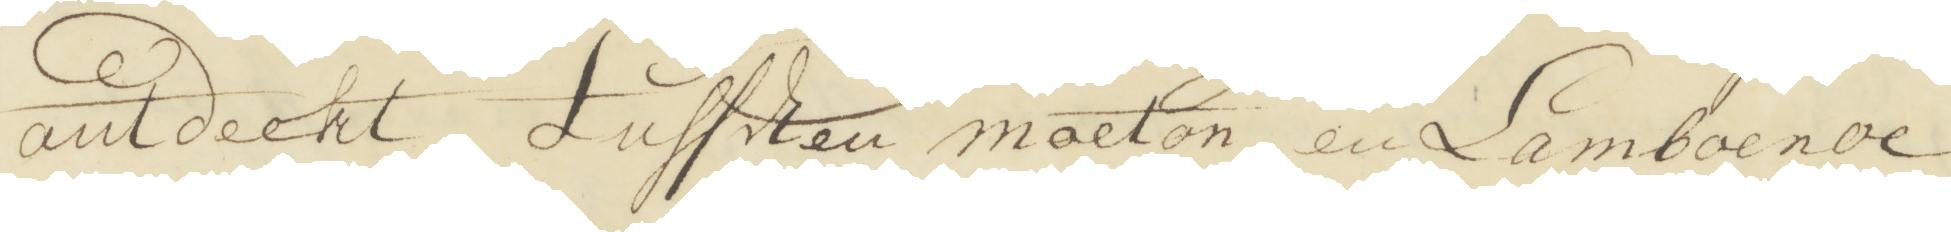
ontdeckt, tusschen moeton, en Lamboenoe
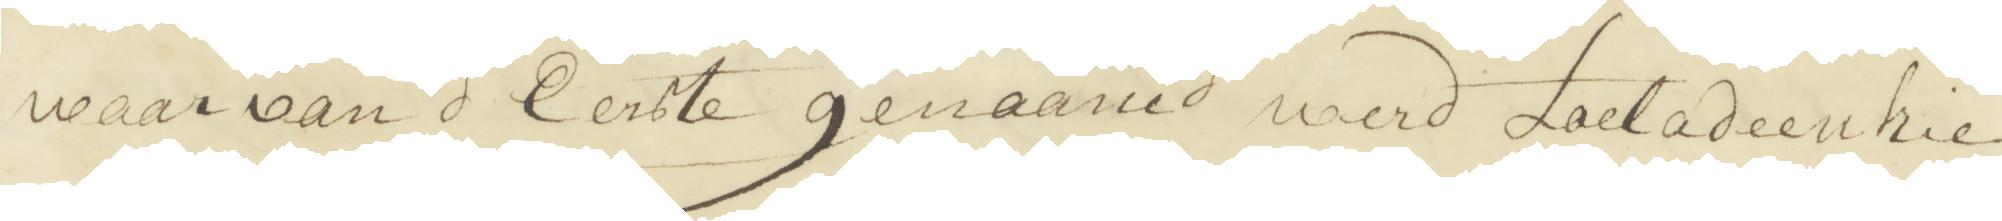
waar van d’ Eerste genaamd werd toeladeenkie
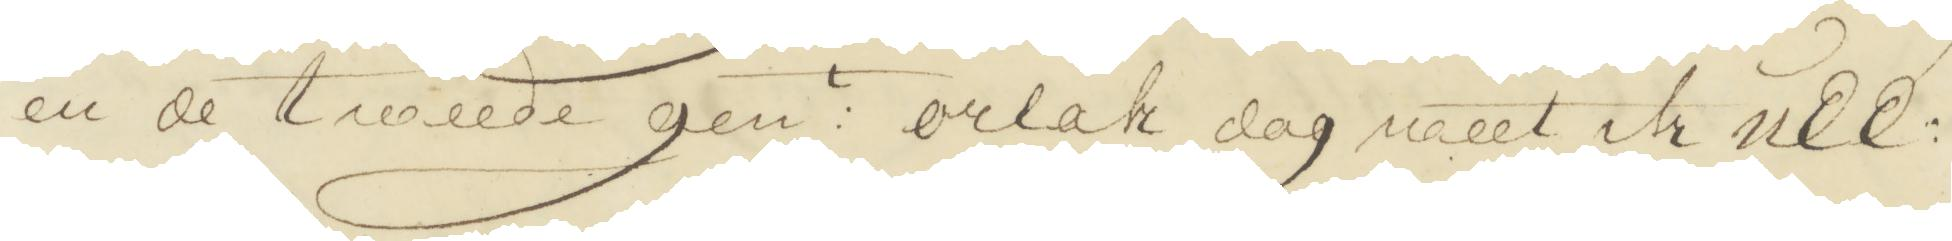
en de tweede gen:t orlak dog weet ik uEE:
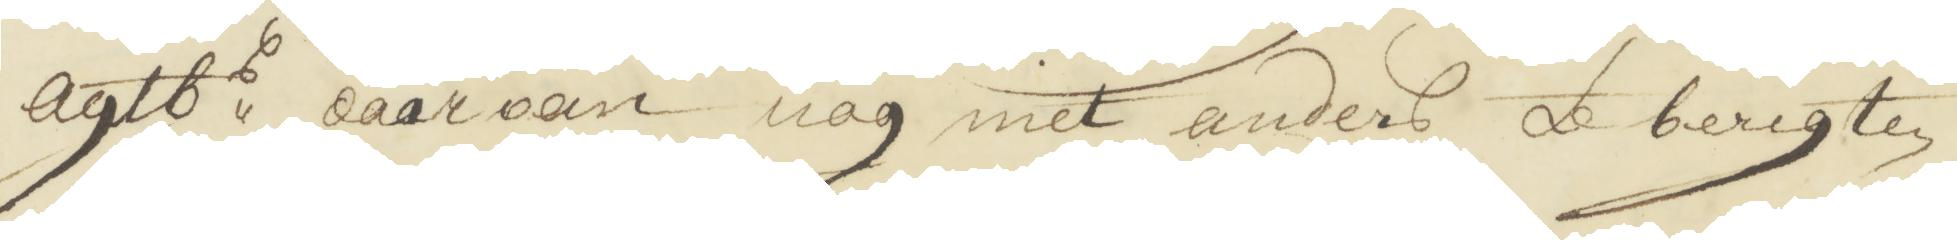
Agtb„s daarvan nog niet anders te berigten
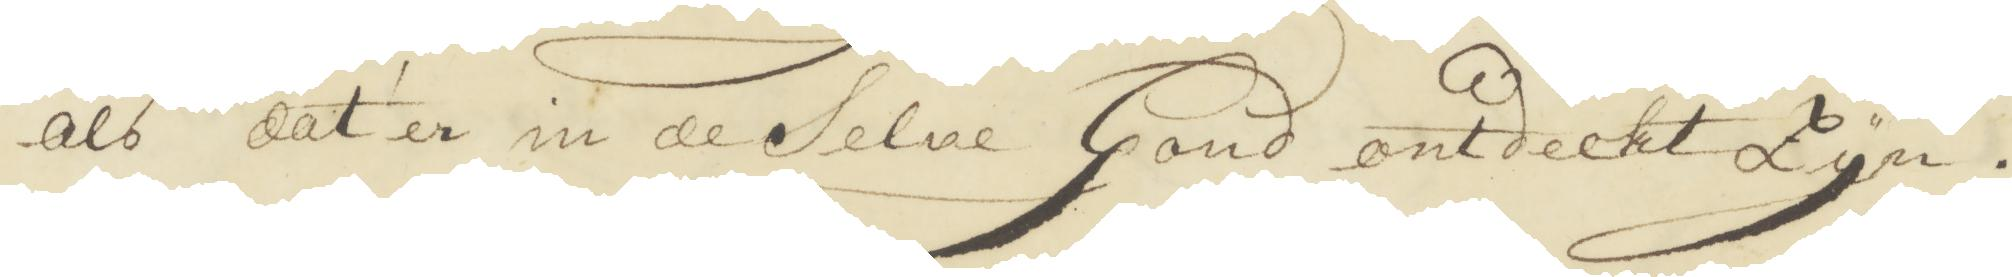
als dat 'er in deselve Goud ontdeckt zijn
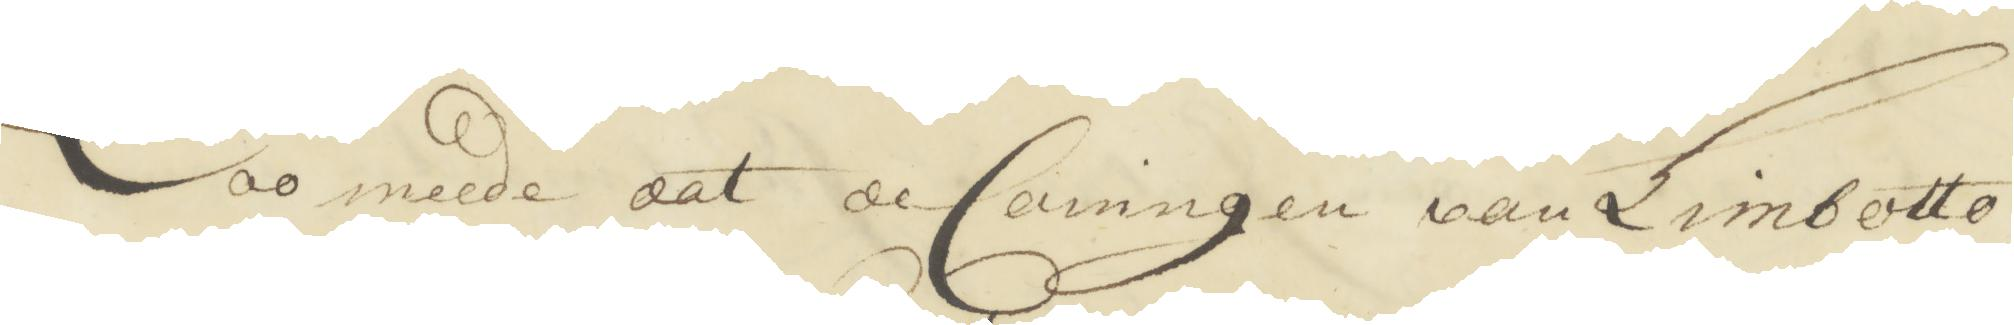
Zoo meede dat de Coningen van Limbotto
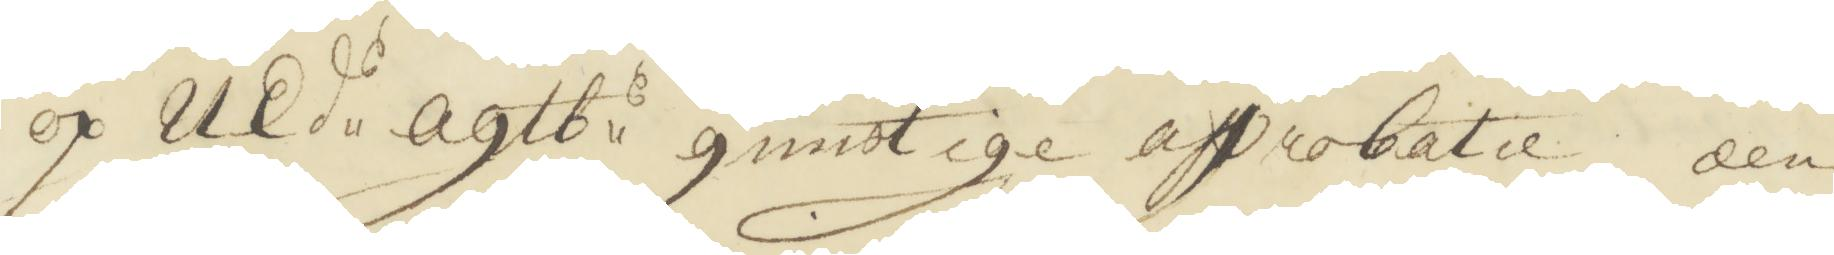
op UEd„s Agtb„s gunstige approbatie, den
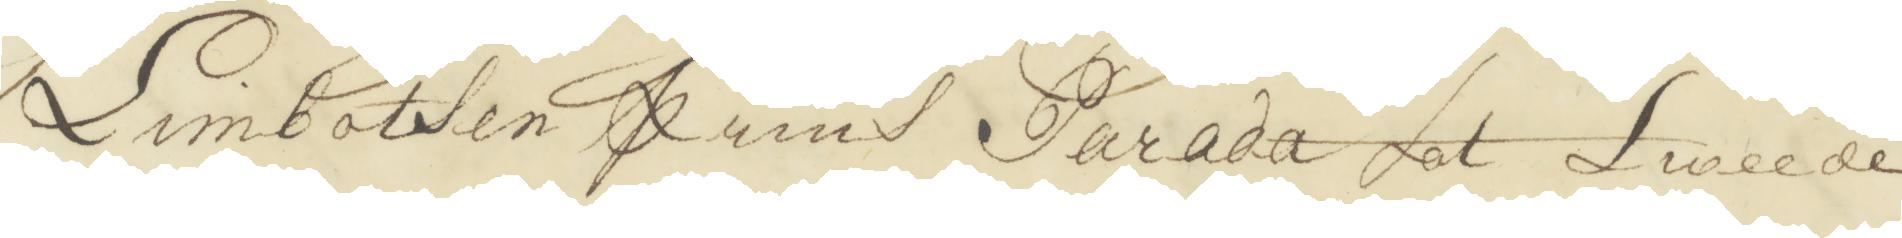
Limbotsen prins Parada tot tweede
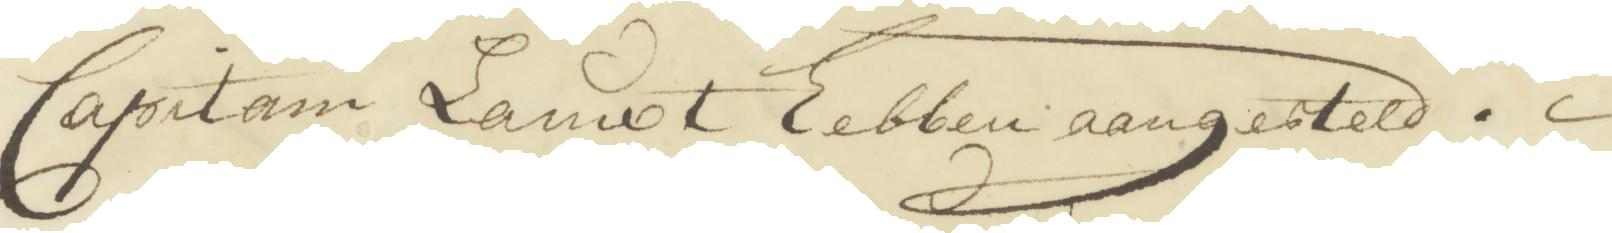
Capitain Lauwt hebben aangesteld. —
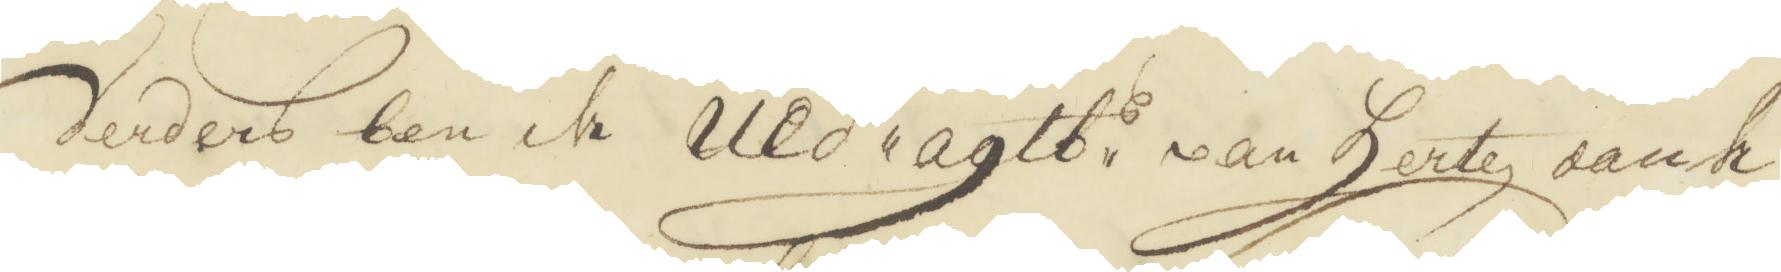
Verders ben ik UEd„s agtb„s van Herte dank
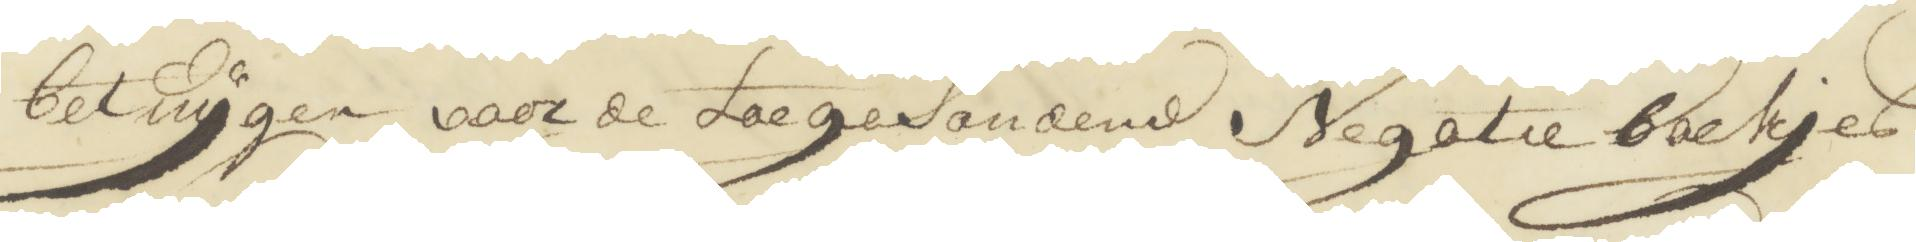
betuijgen voor de toegesondene Negotie boekjes
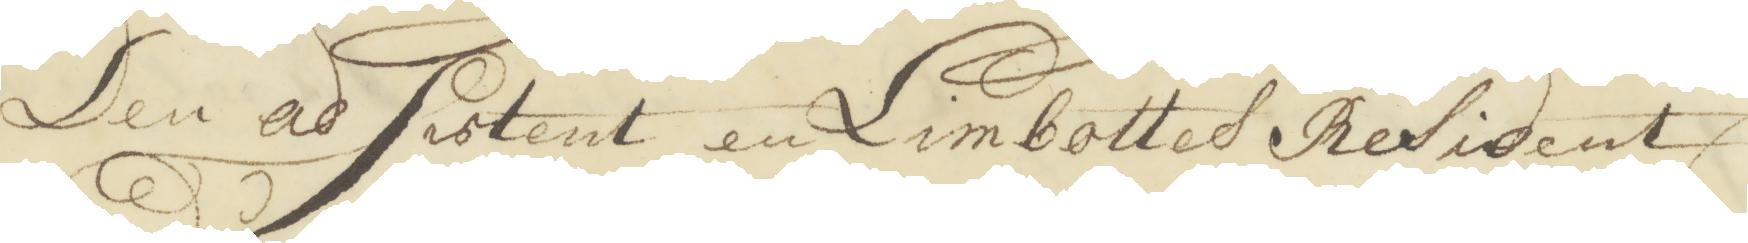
Den adsistent en Limbottes Resident
